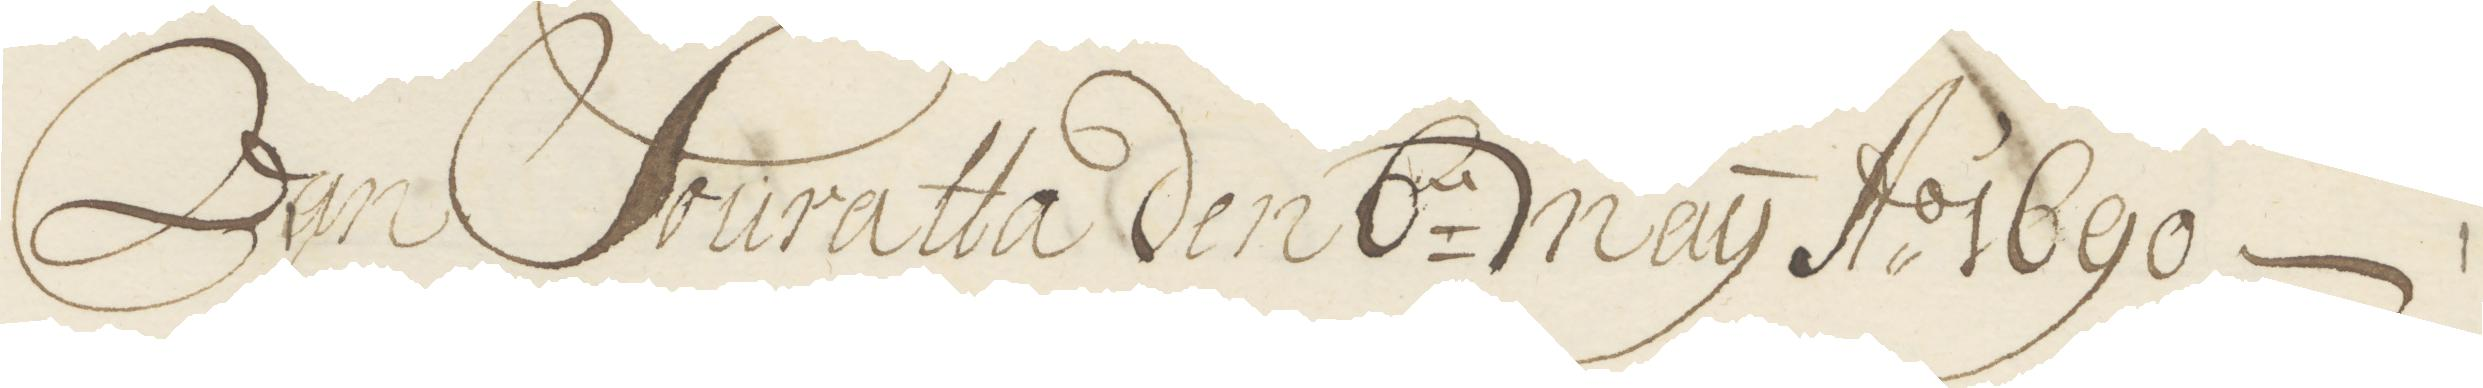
Van Souratta den 6=' Maij A„o 1690 —
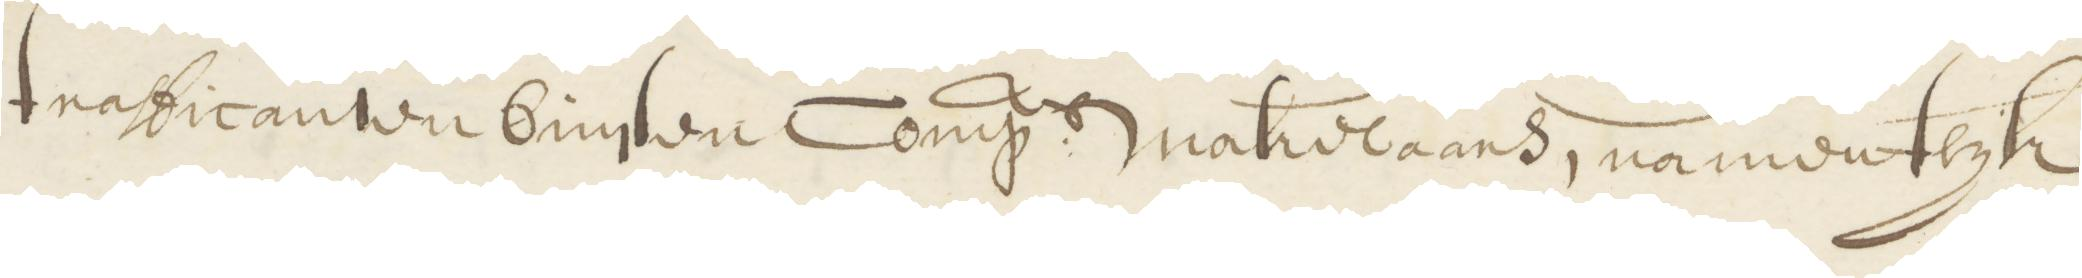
trafficanten buijten Comp:s makelaars, namentlijk
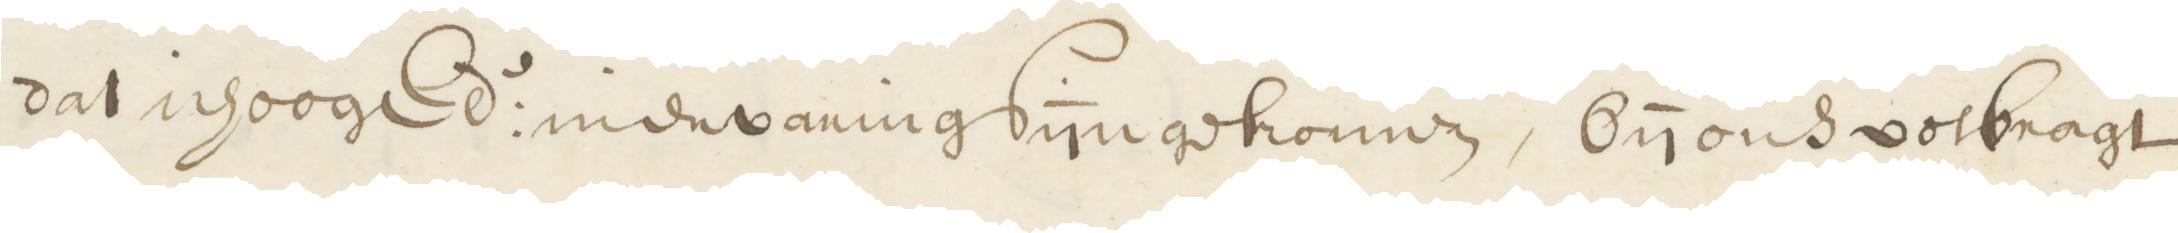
dat uhoog Ed:e in ervaring sijn gekomen, bij ons volbragt
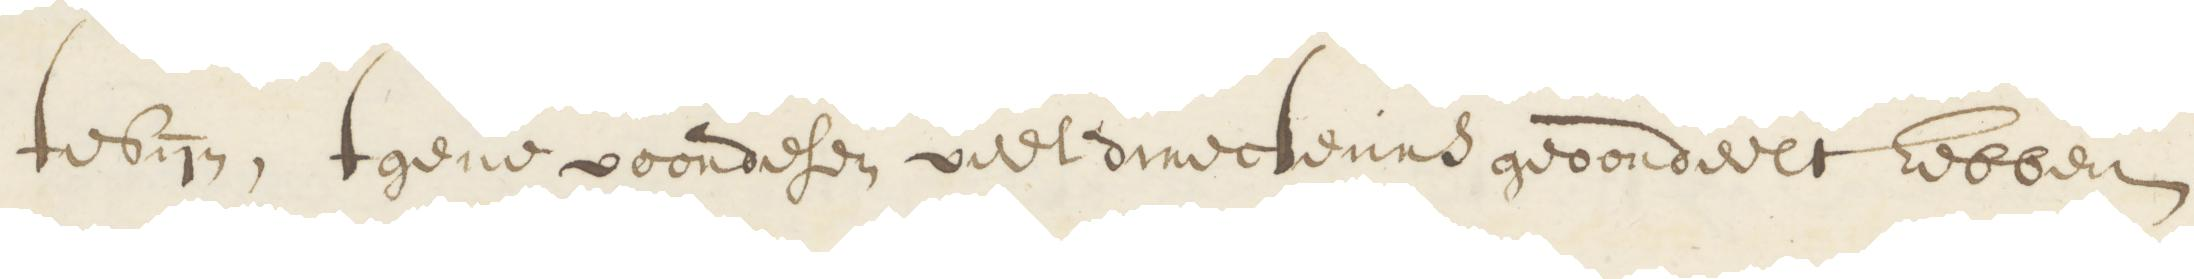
tesijn, tgene voordesen veel directeurs geoordeelt hebben
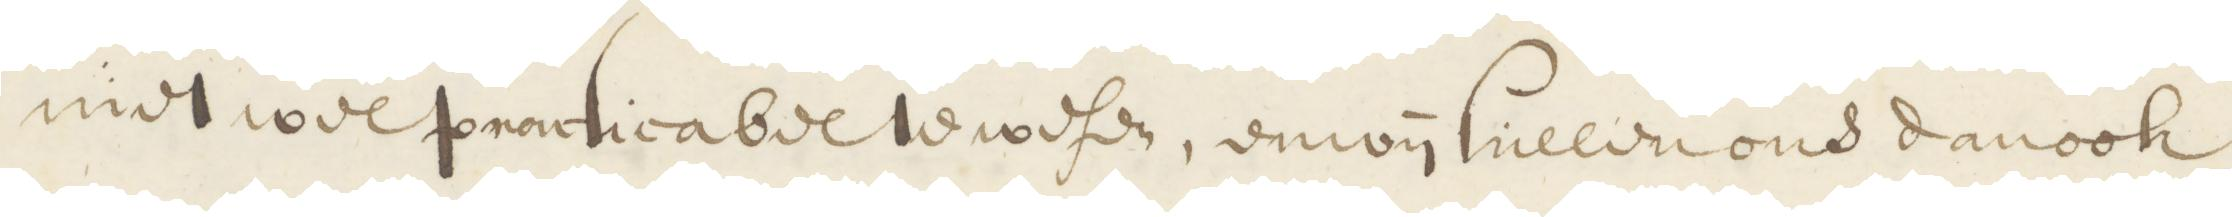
niet wel practicabel te wesen, en wij sullen ons dan ook
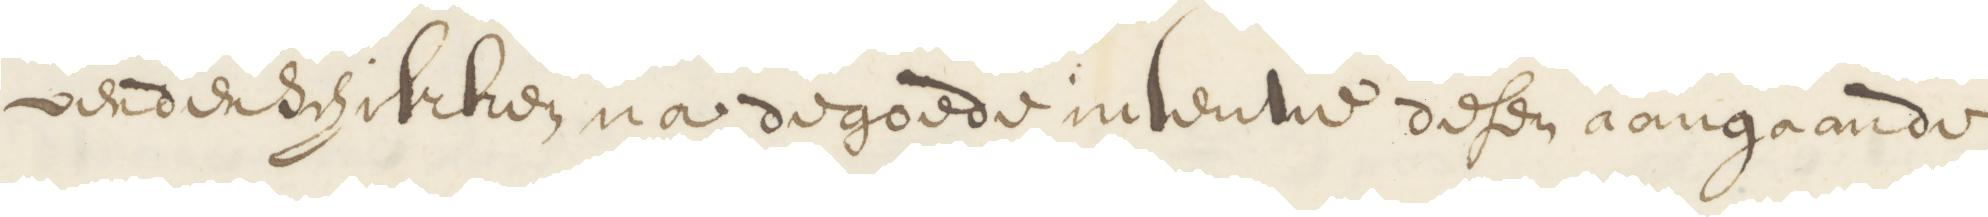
verderschikken na de goede intentie desen aangaande
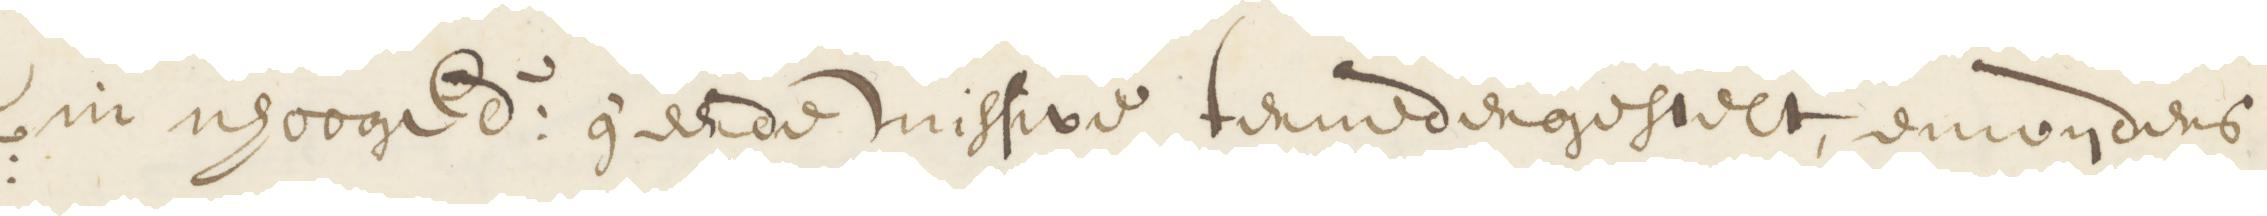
in uhoog Ed:e g’eerde missive ternedergestelt, en wijders
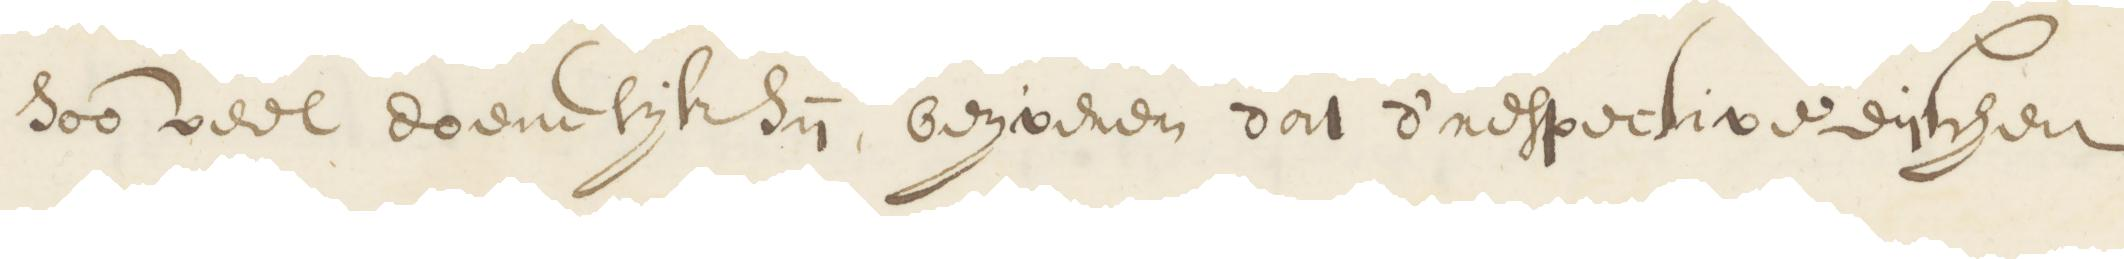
soo veel doenelijk sij, beijveren dat d’ respective eijschen
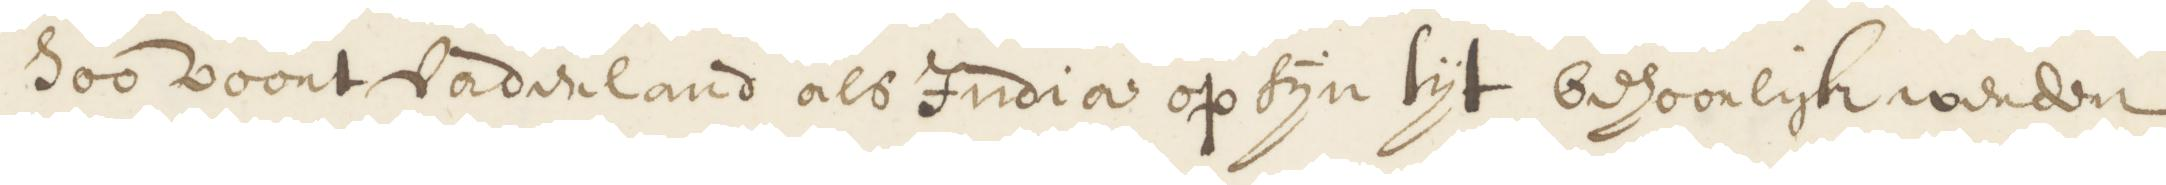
soo voort vaderland als Jndia op sijn tijt behoorlijk werden
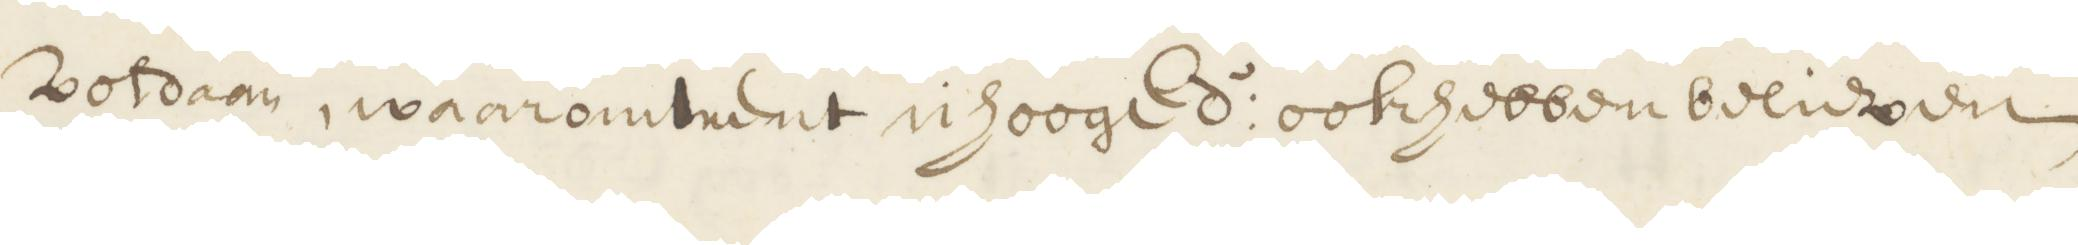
voldaan, waaromtrent uhoog Ed:e ook hebben believen
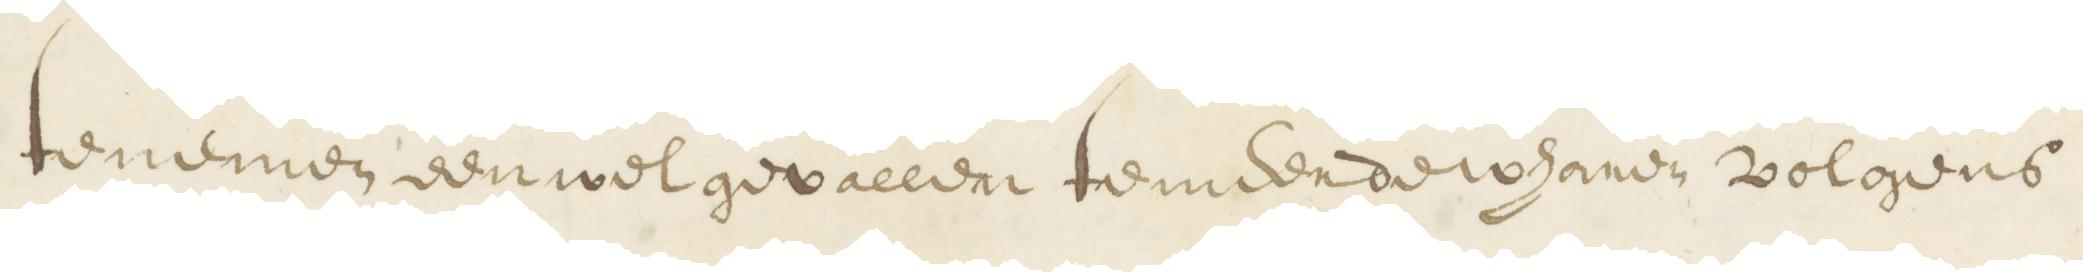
tenemen een wel gevallen te meerde wharen volgens
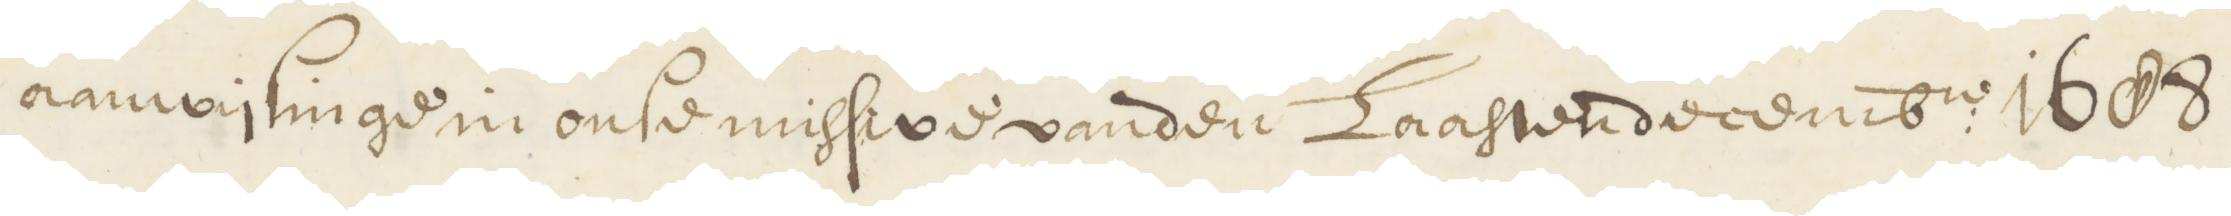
aanwijsinge in onse missive vanden laasten decemb:r 1688
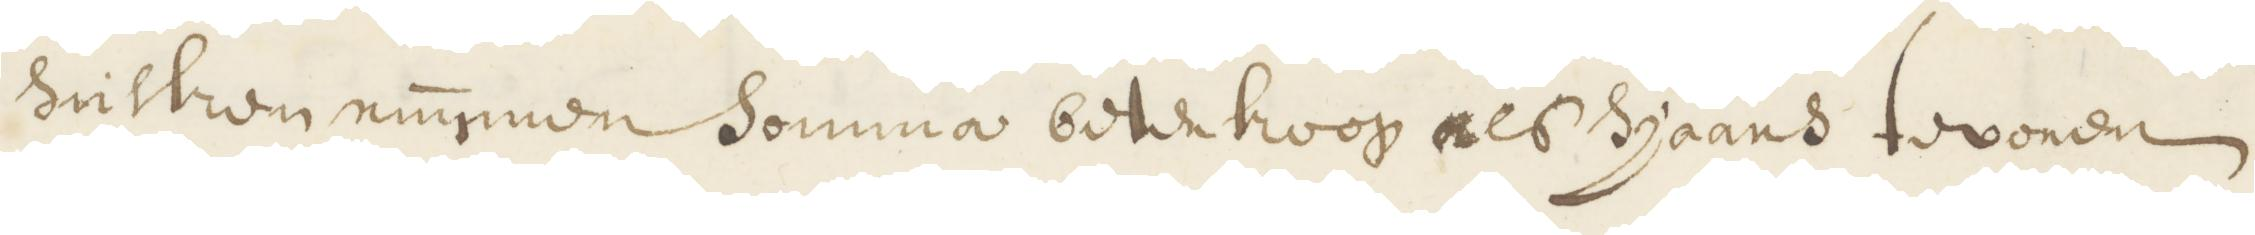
sulken ruijmen somma beter koop als sjaars tevoren
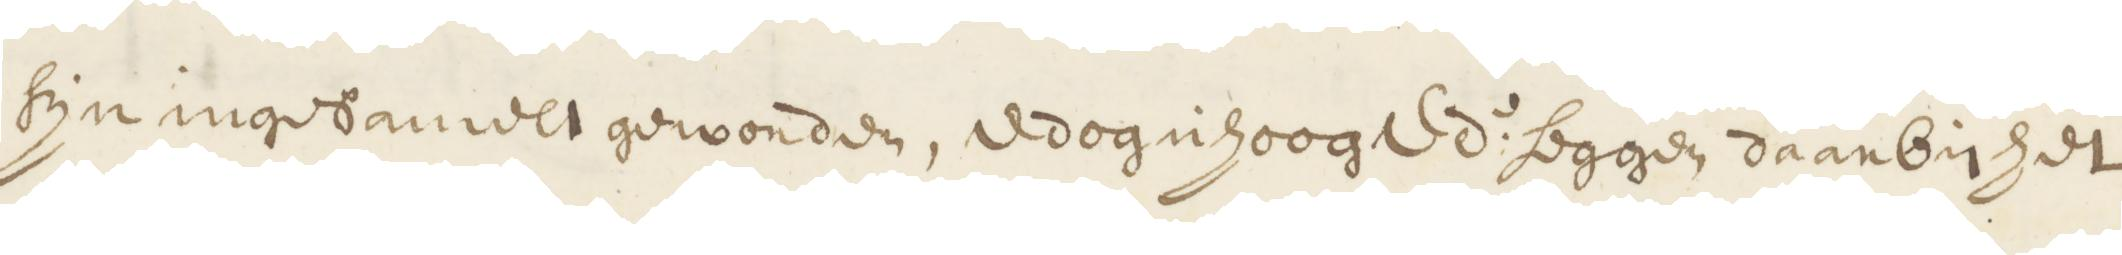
sijn ingesamelt geworden, edog u hoog Ed:e seggen daarbij het
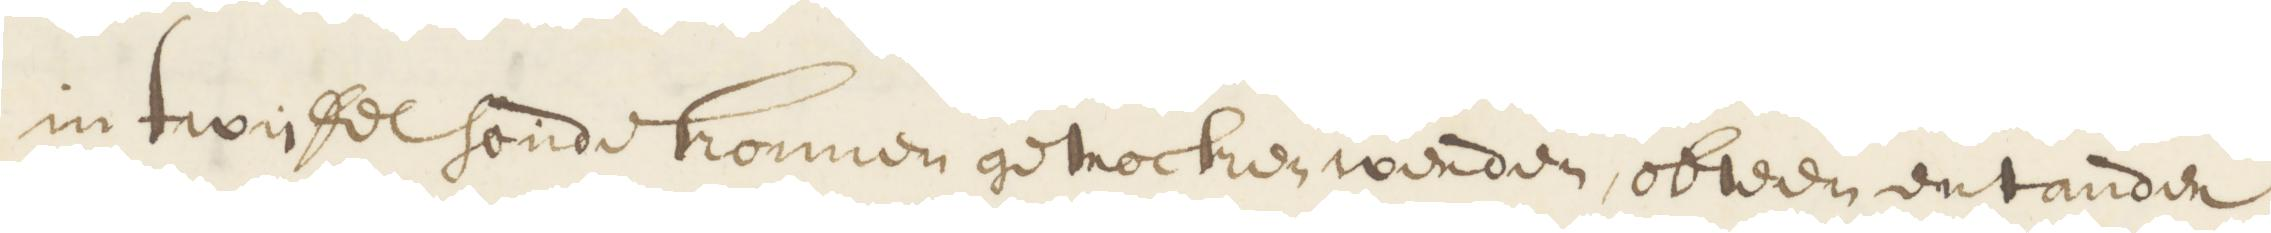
in twijfel soude konnen getrocken werden, ofteen entander
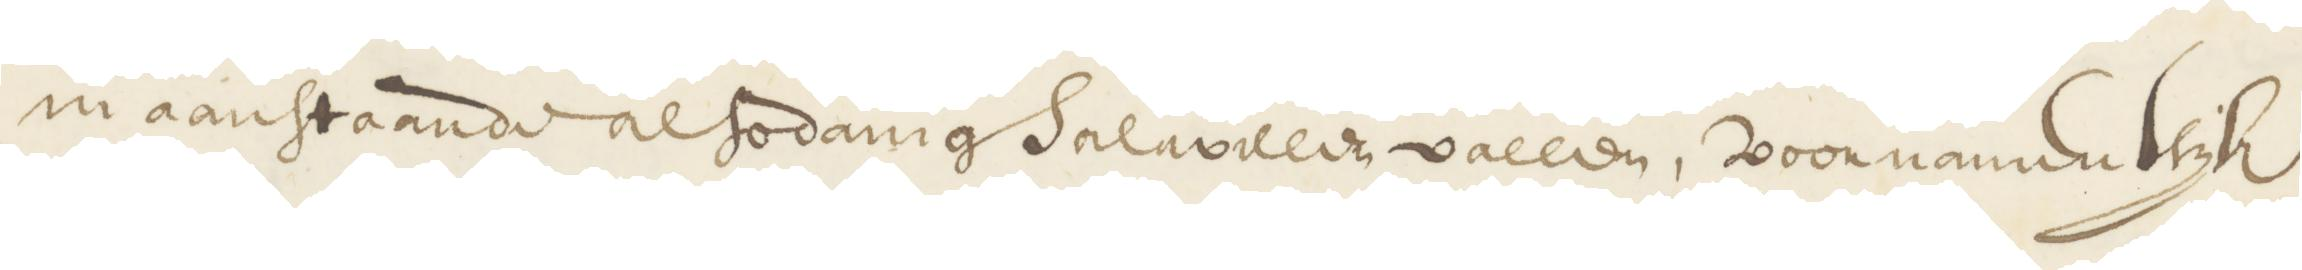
in aanstaande al sodanig sal willen vallen, voornamentlijk
